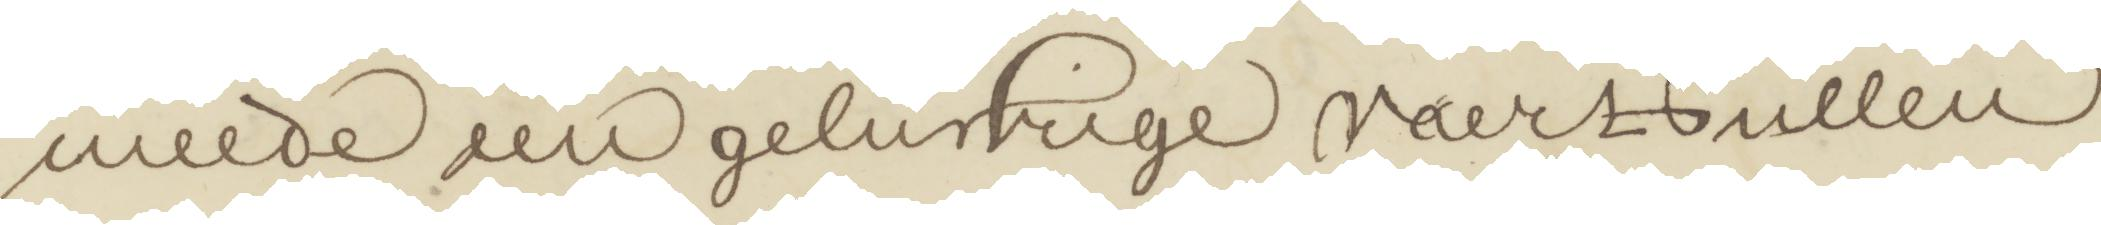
meede een geluckige vaert sullen
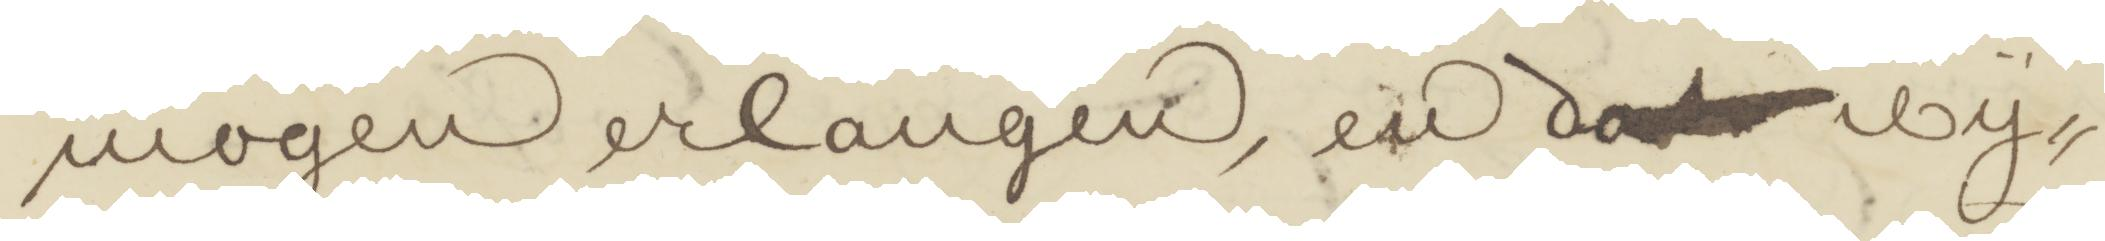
mogen erlangen, en dat wij„
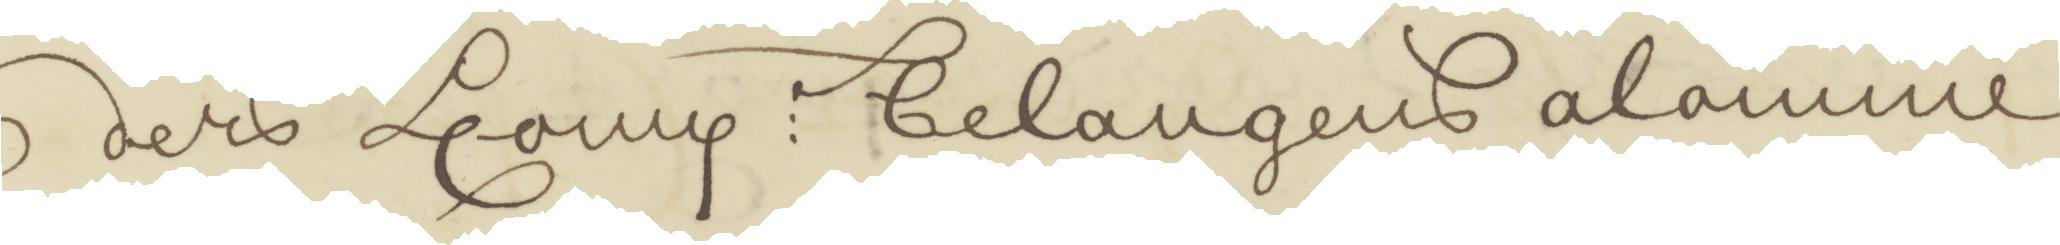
ders 'sComp:s belangens alomme
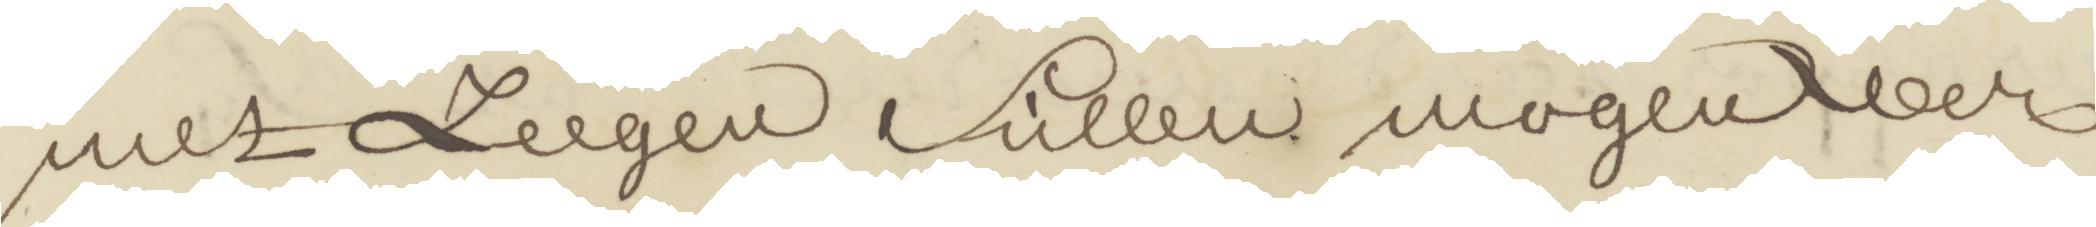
met zeegen sullen mogen wer
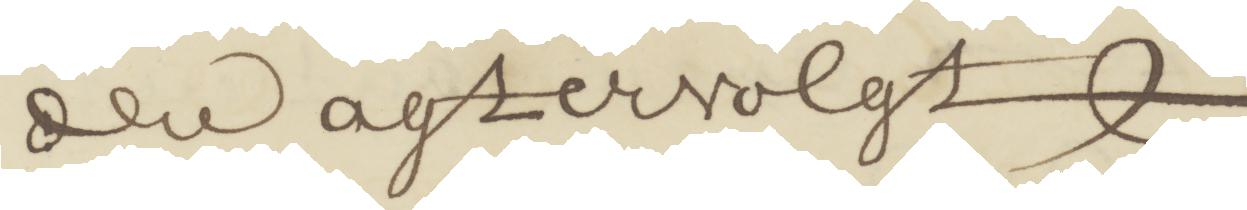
den agtervolgt
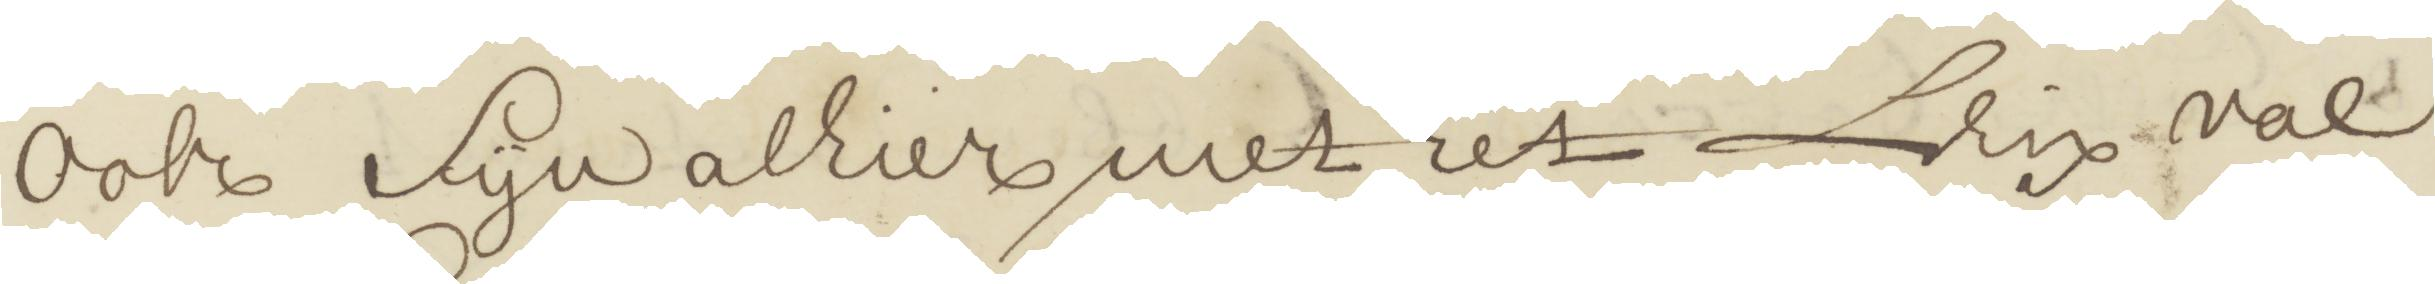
Ook sijn alhier met het schip val
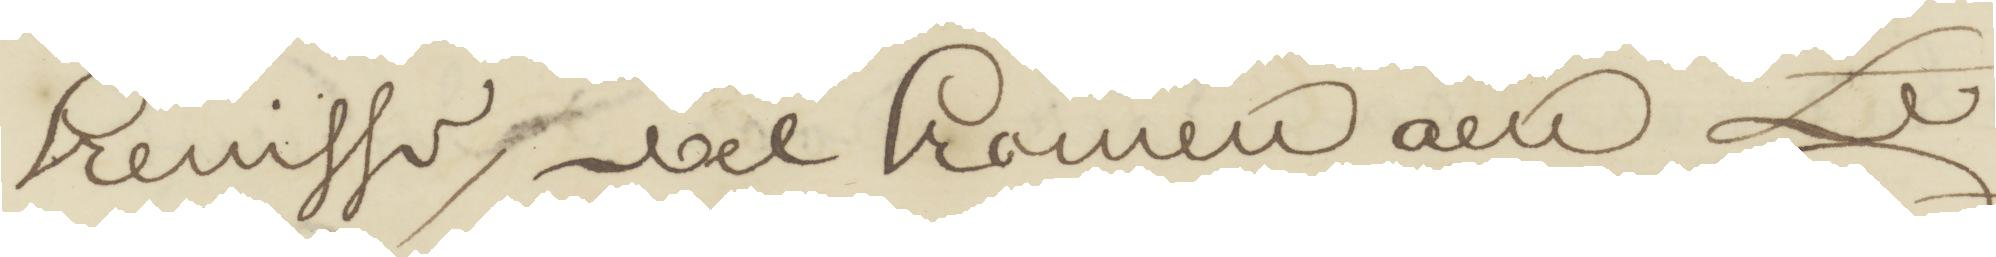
kenisse, wel komen aen te
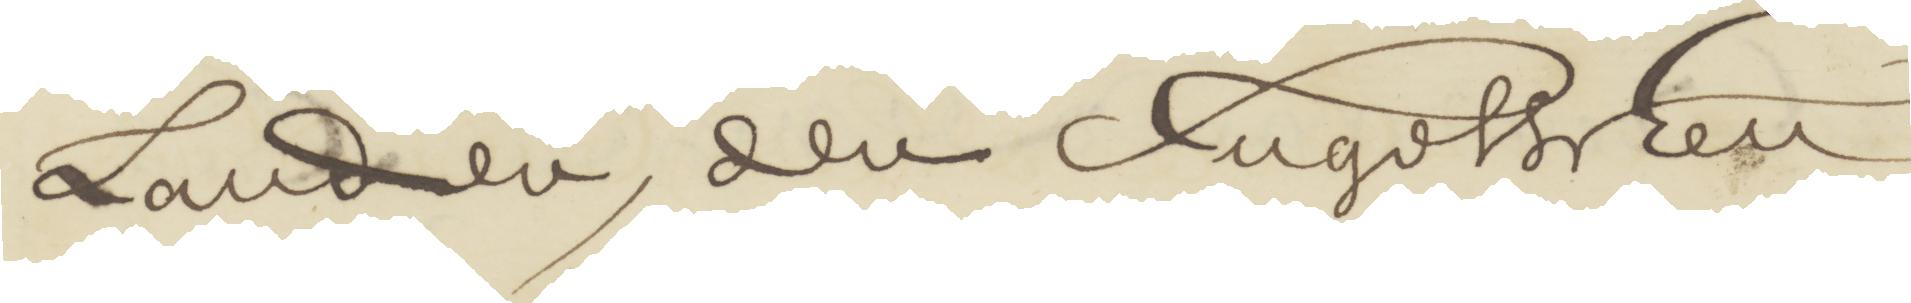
Landen, den Engelschen
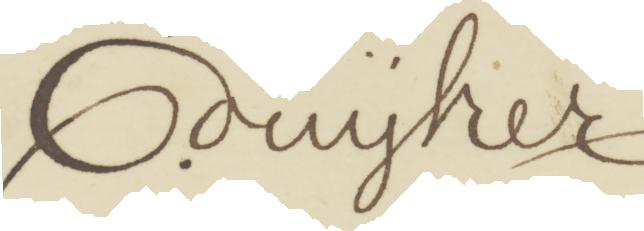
duijker
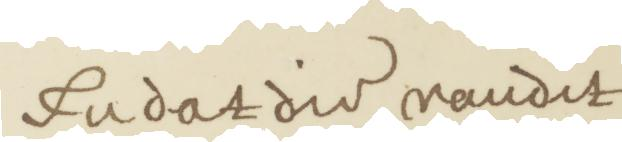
En dat die van dit
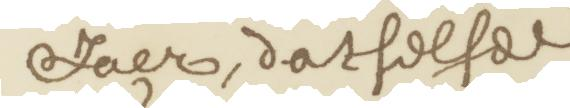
Iaer, dat selfde
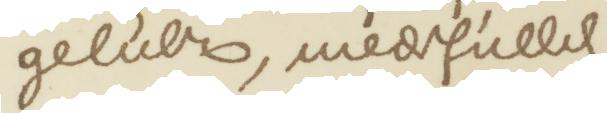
geluk, mede sullen
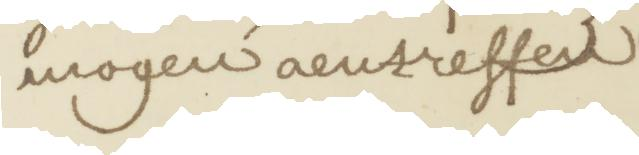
mogen aentreffen
